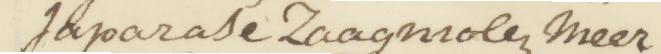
Japarase Zaagmolen meer
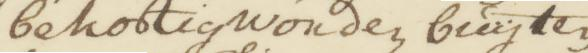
bekostig worden buijten
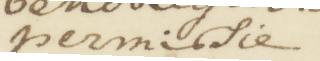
permissie
